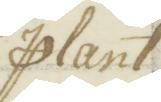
plant
